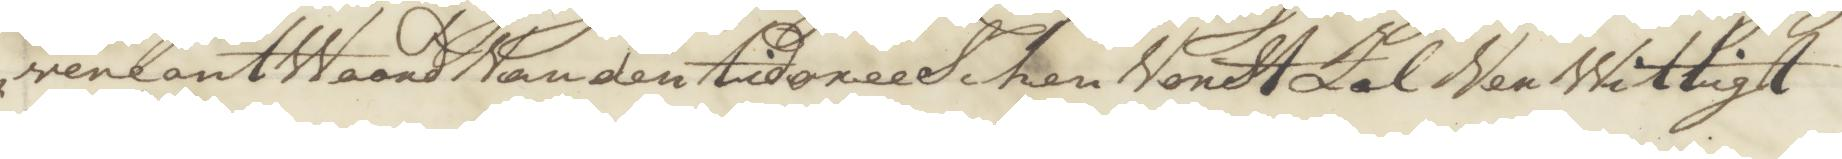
vene antwoord van den tidoreeschen vorst zal ver wittigt
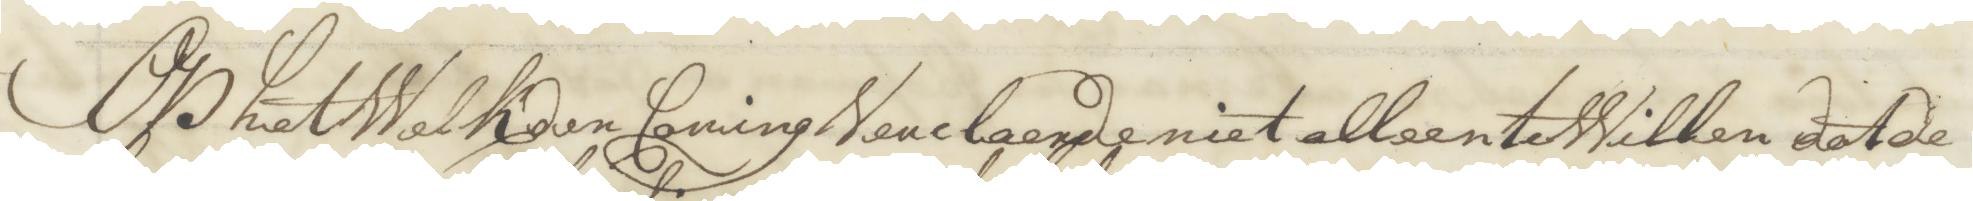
Op het welk den Coning verclaarde niet alleen te willen dat de
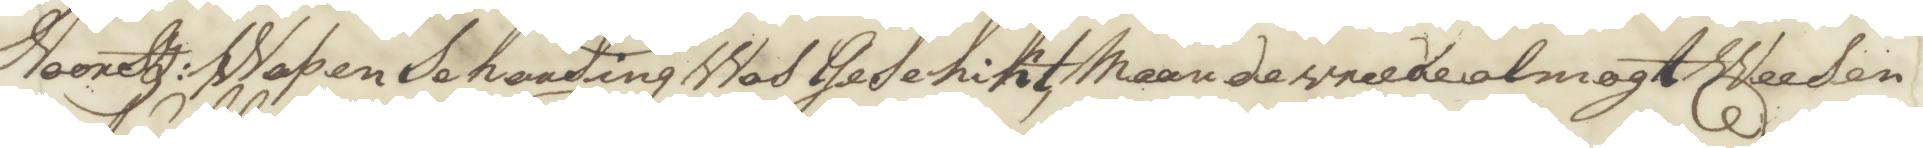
voorsz: wapen schorsing was Geschikt, maar de vreede almogt weesen
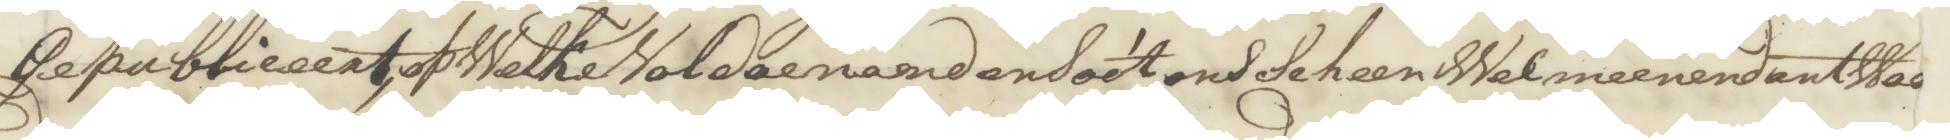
gepubliceert op welke voldoen aenden soo't ons scheen welmeenend antwoo
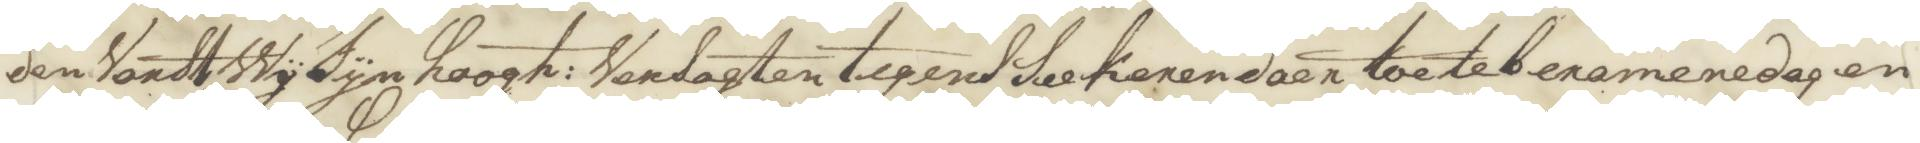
den vorst wij sijn hoogh: versogten tegens seekeren daer toe te beramen edog en
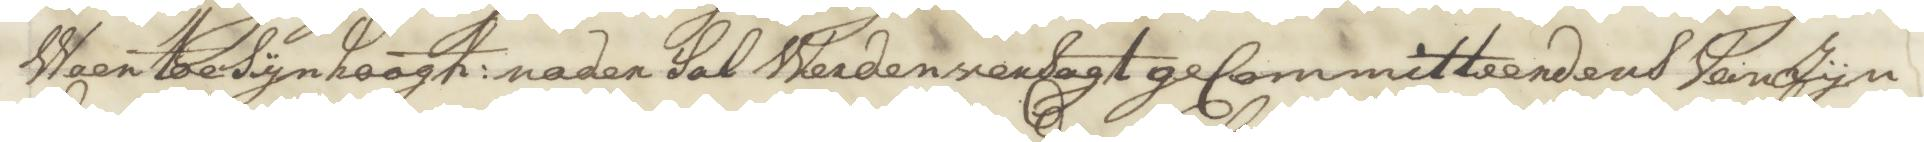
waer toe sijn hoogh: nader sal werden versogt gecommitteerdens van zijn
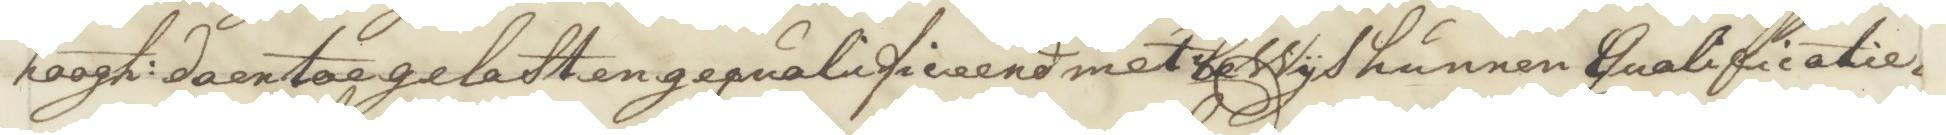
hoogh: daertoe gelast en gequalificeerd met bewijs hunnen qualificatie
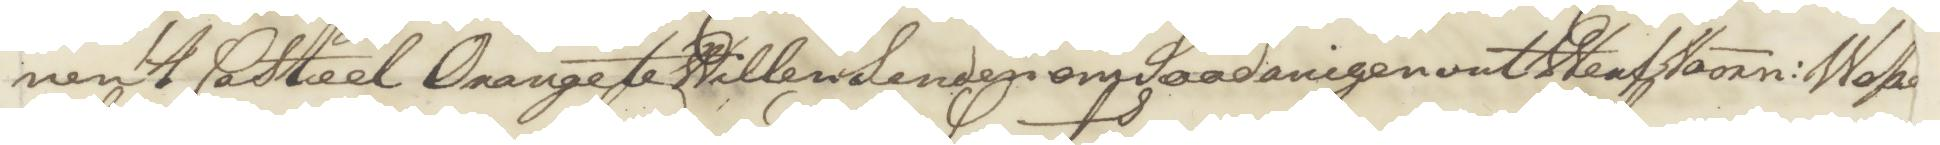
nen ’t Casteel Orange te willen senden om soodanigen ontwerp voorn: wap
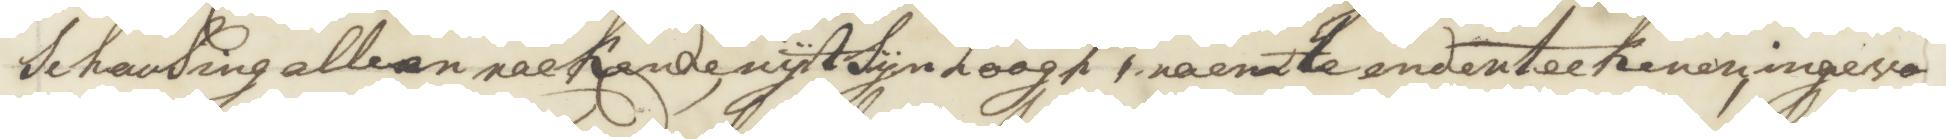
schorsing allean raekende uijt sijn hoogh„s naem te onderteekenen ingevo
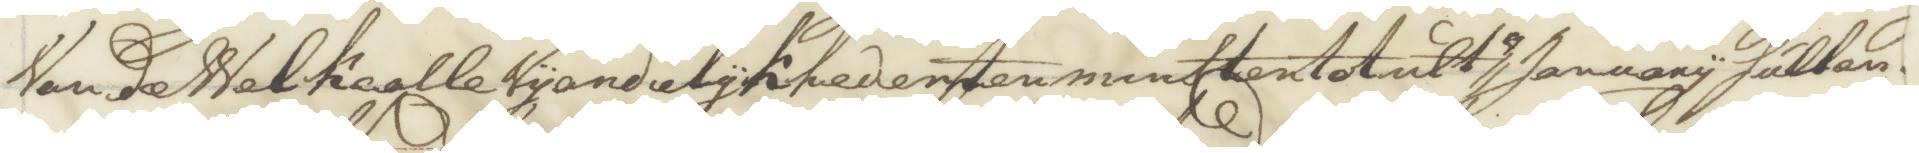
van dewelke alle vijandelijkheden ten minsten tot ult„o Januarij sullen
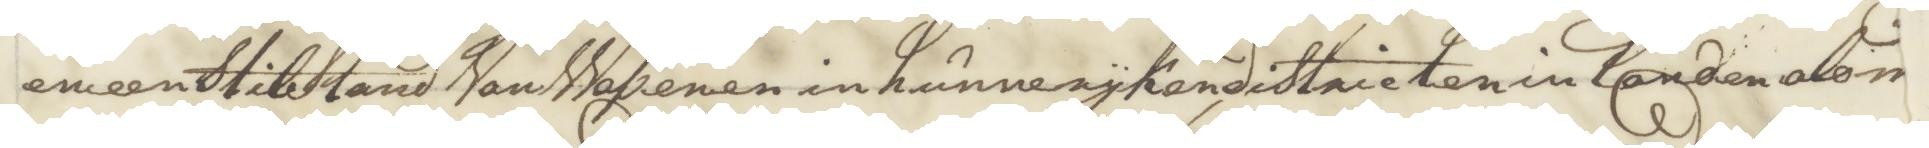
om een stilstand van wapenen in hunne rijk en districten in landen als n
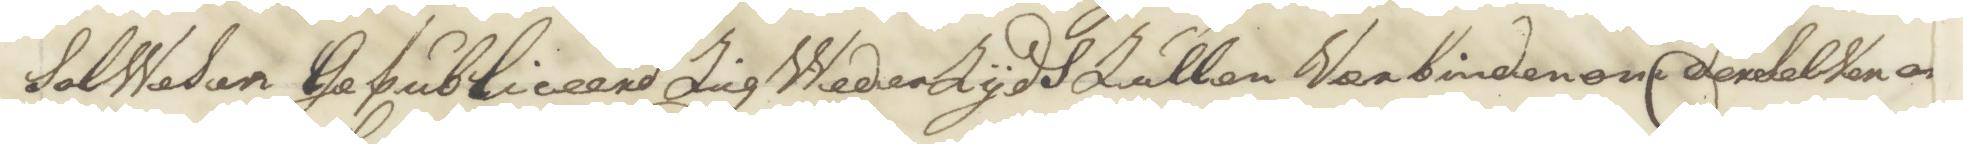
sal wesen Gepubliceerd zig wederzijds zullen verbinden om derselven o
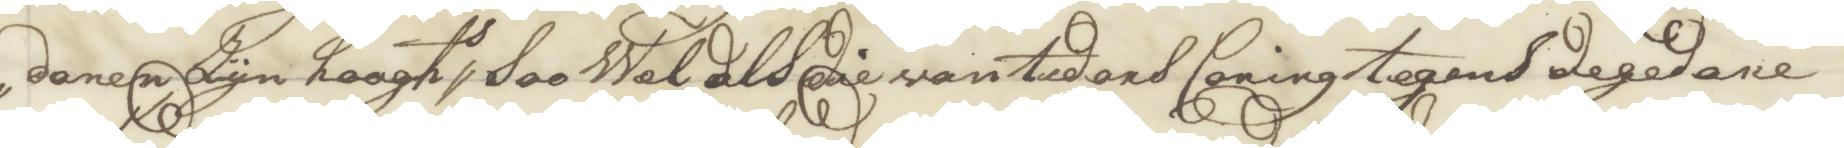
danen zijn hoogh„s soo wel als die van tidors Coning tegens de gedane
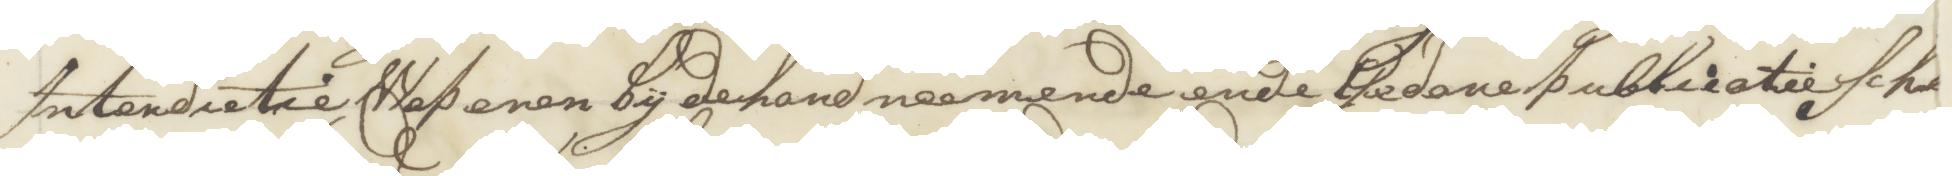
Jnterdictie wapenen bij de hand neemende ende Gedane publicatie sch
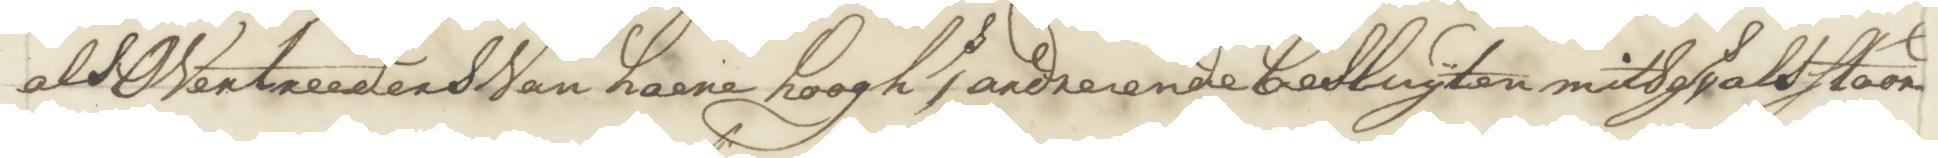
als vertreeders van haere hoogh„s ordrerende besluijten mitsg„s als staar
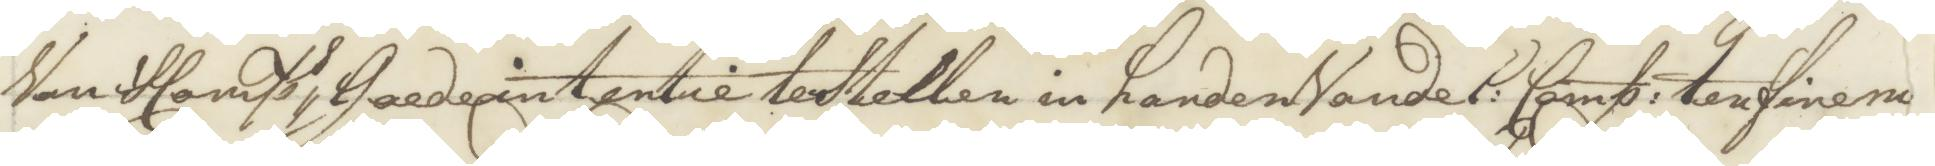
van 'sComp„s Goede intentie te stellen in handen vande E: Comp: ten fine n
